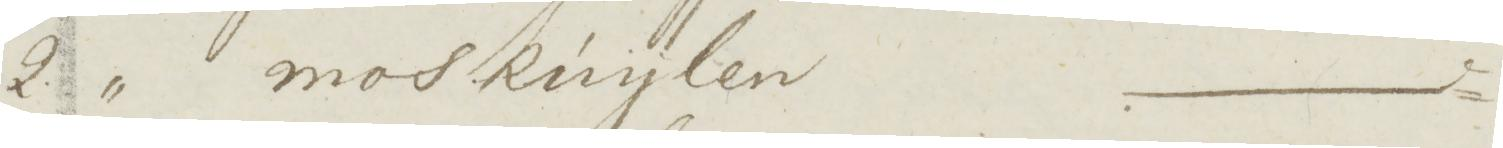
2. „ moskuijlen _=o
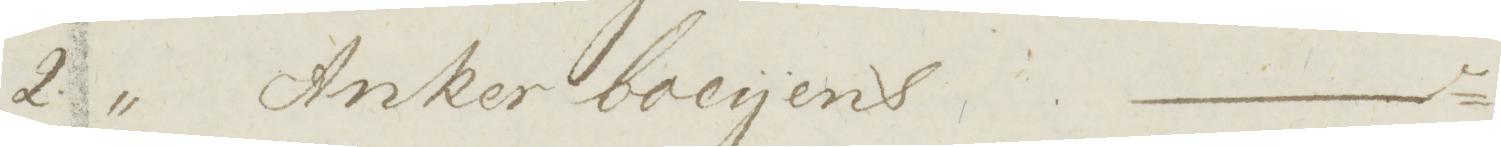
2. „ Anker boeijens _=o
